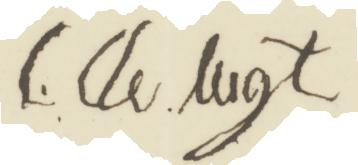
C: de: lugt
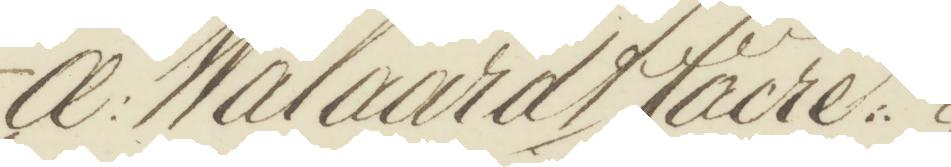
Ae: Walaardt Sacre:
